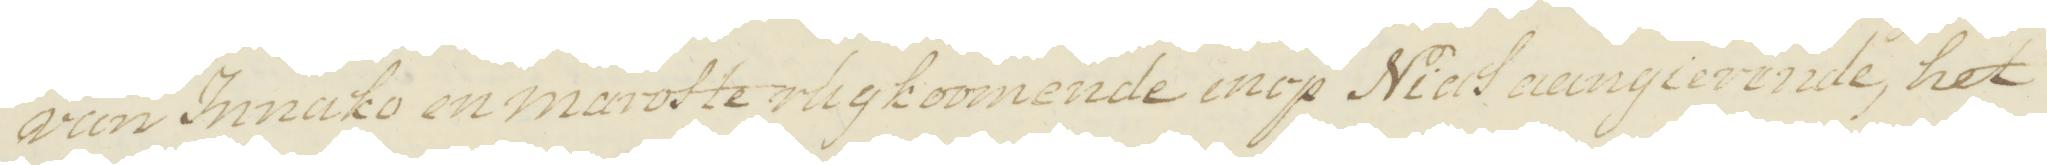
van Jnnako en maros te rug koomende en op Nias aangievende, het
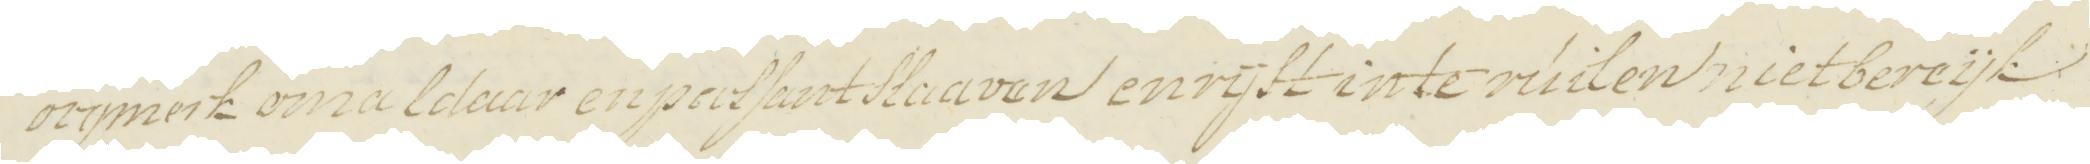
oogmerk om aldaar en passant slaaven en rijst in te ruilen niet bereijk
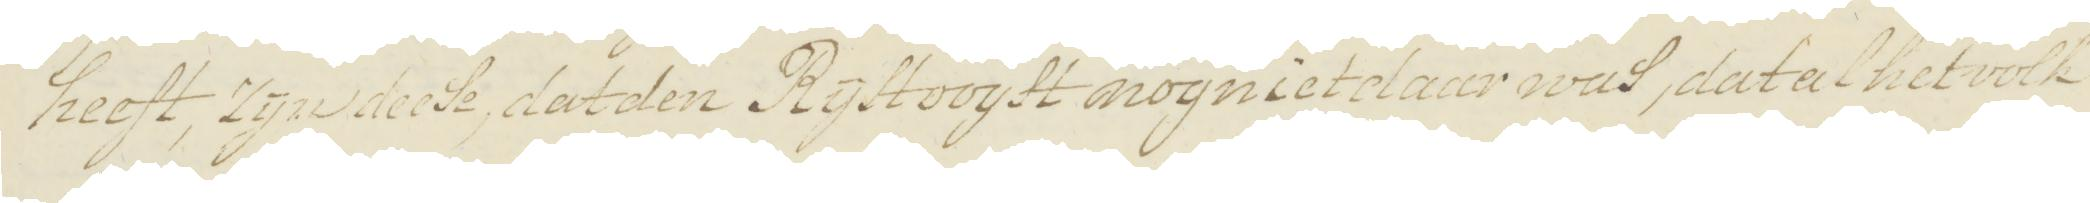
heeft, zijn deese, dat den Rijstoogst nog niet daar was, dat al het volk
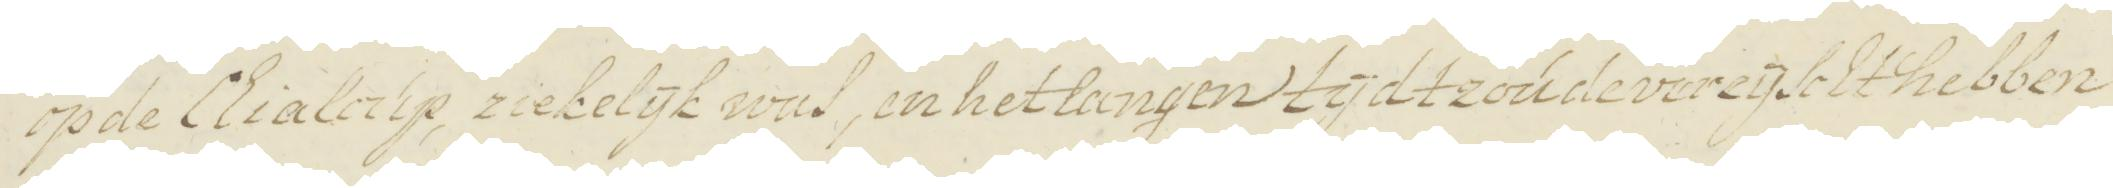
op de Chialoup ziekelijk was, en het langen tijdt zoude vereijscht hebben
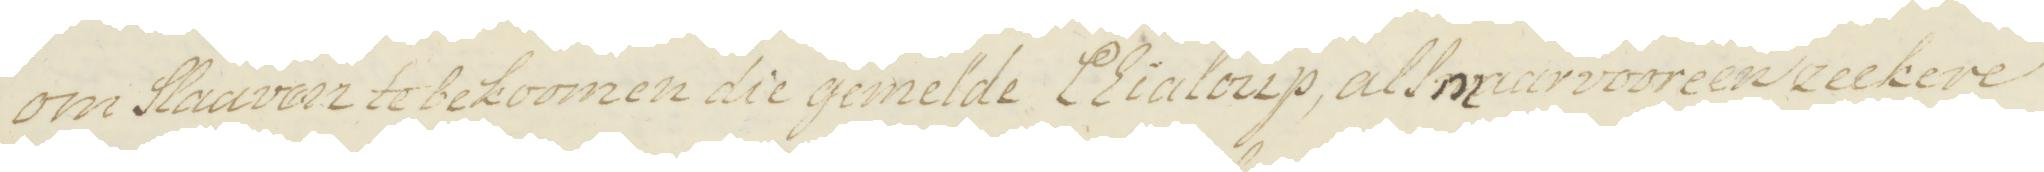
om slaaven te bekoomen die gemelde Chialoup, als maar voor een zeekere
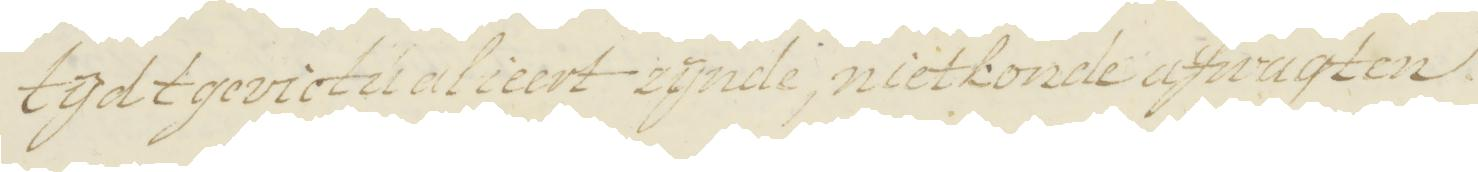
tijdt gevictualieert zijnde, niet konde afwagten
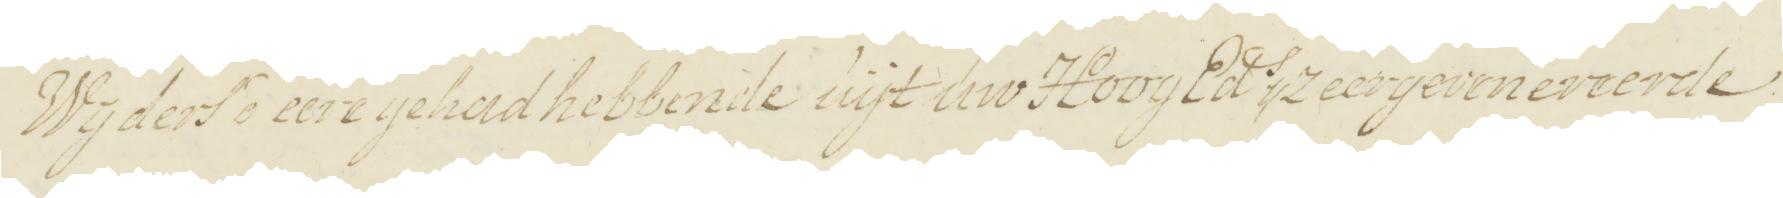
Wijders d'eere gehad hebbende uijt uw Hoog Ed„s zeer gevenereerde
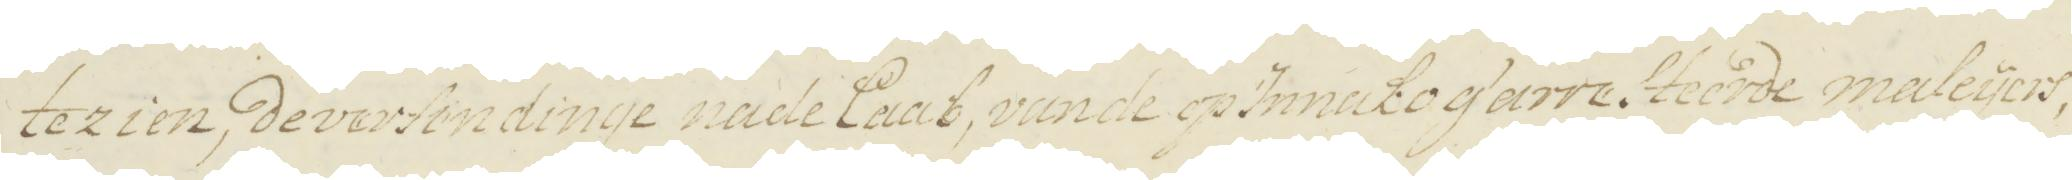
tezien, de versendinge nade Caab, van de op Jnnako g'arresteerde maleijers,
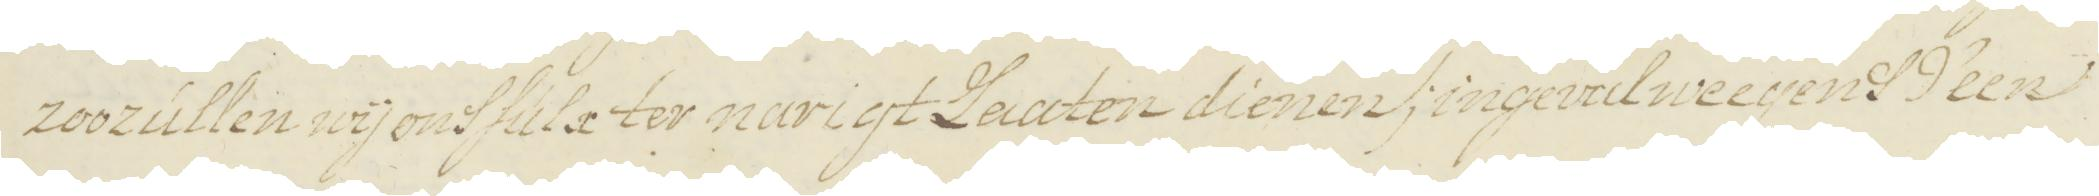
zoo zullen wij ons sulx ter narigt laaten dienen, ingeval weegens d'een
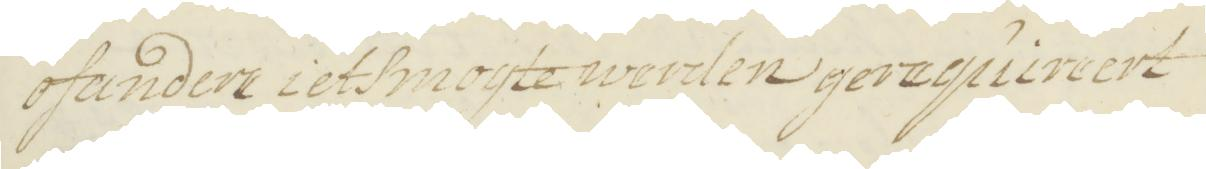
of andere iets mogte werden gerequireert
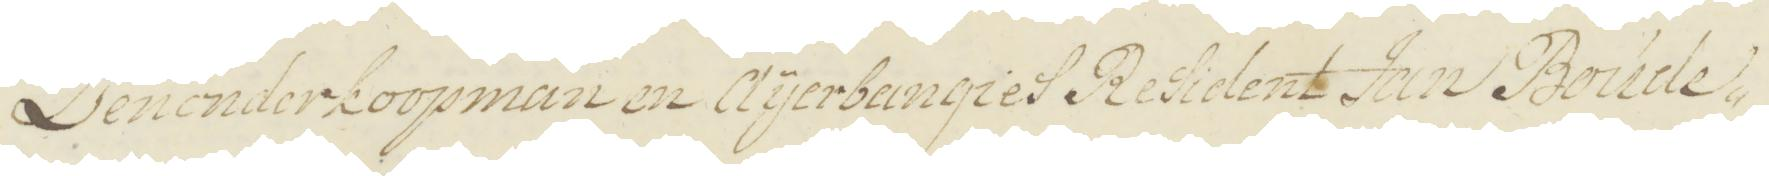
Den onderkoopman en Aijerbangies Resident Jan Boude„
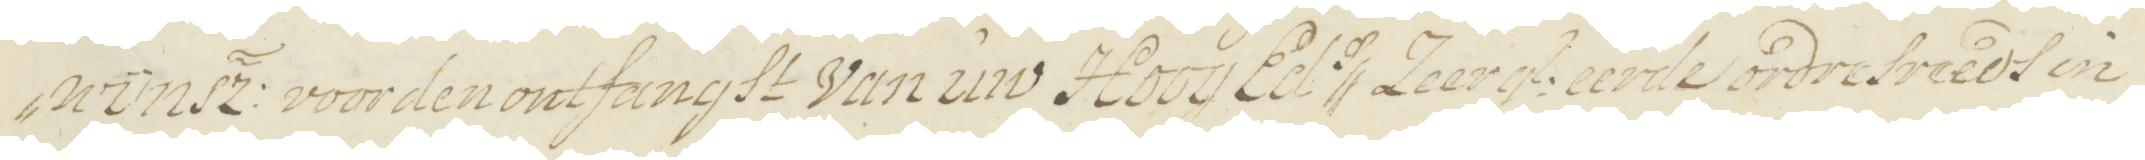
„wijnsz. voor den ontganst van uw Hoog Ed„s zeer g'eerde ordres reeds in
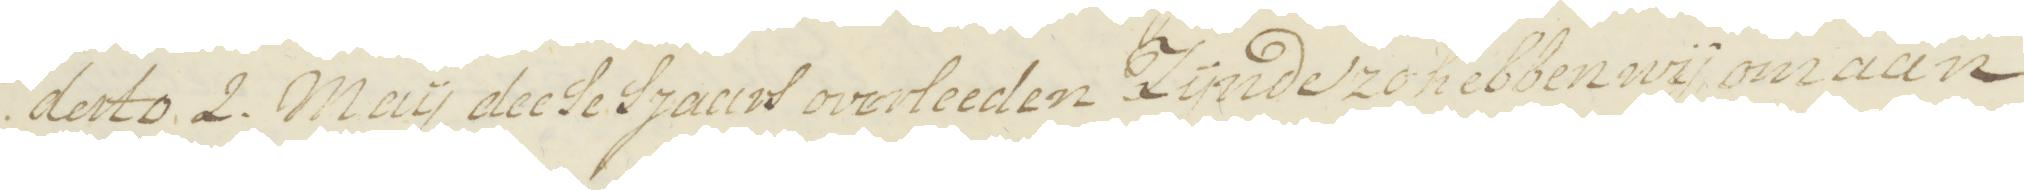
dato 2. maij deeses jaars overleeden Zijnde zo hebben wij om aan
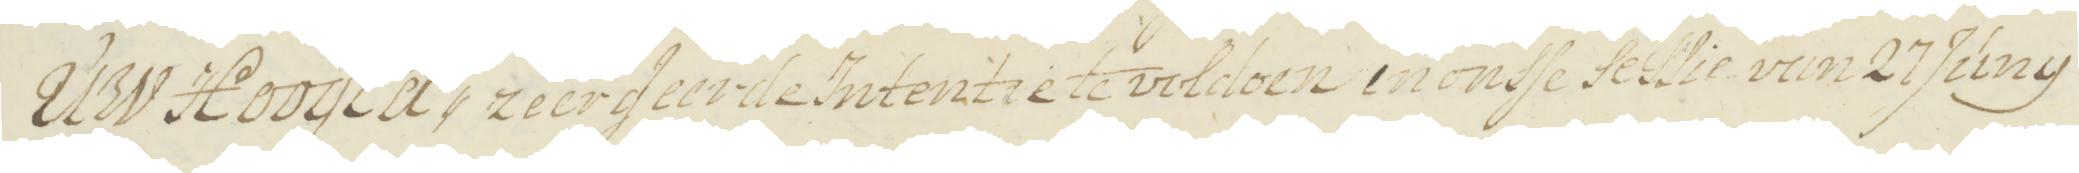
Uw Hoog Ed„s zeer g'eerde Jntentie te voldoen in onsse sessie van 27 Juny
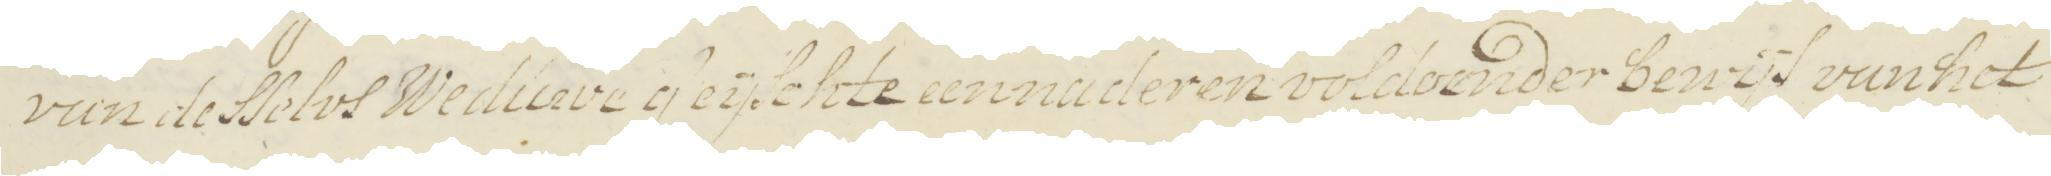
van desselvs weduwe g'eischte een naderen voldoender bewijs van het
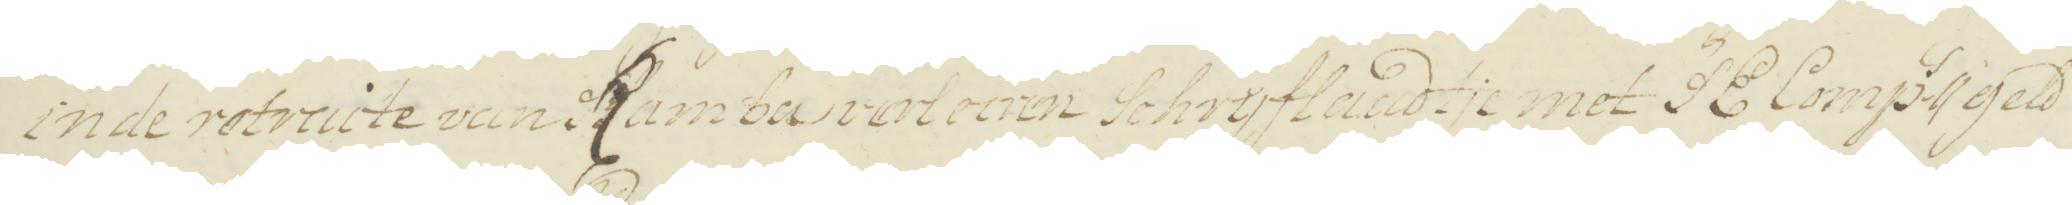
in de rotruite van Ramba verlooren schrijflaadtje met 's E Comp„s geld
